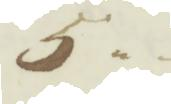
5 „ —
